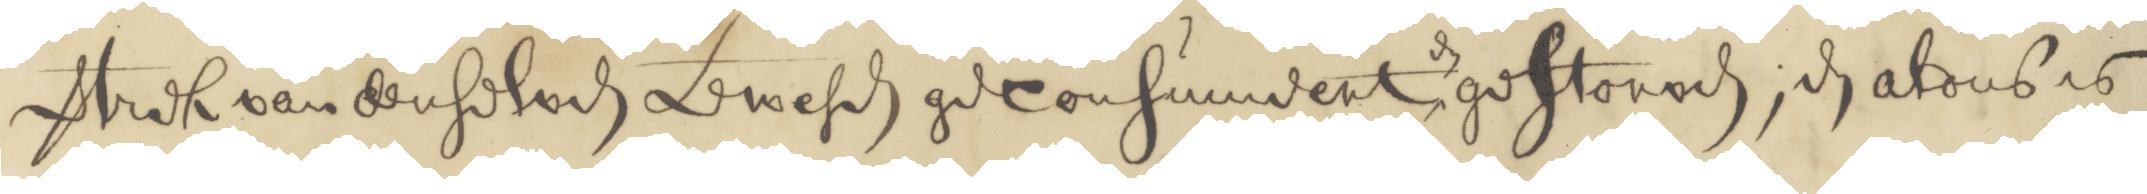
vertrek van denselven tewesen geconsumeert ^ en gestorven; en aldus is
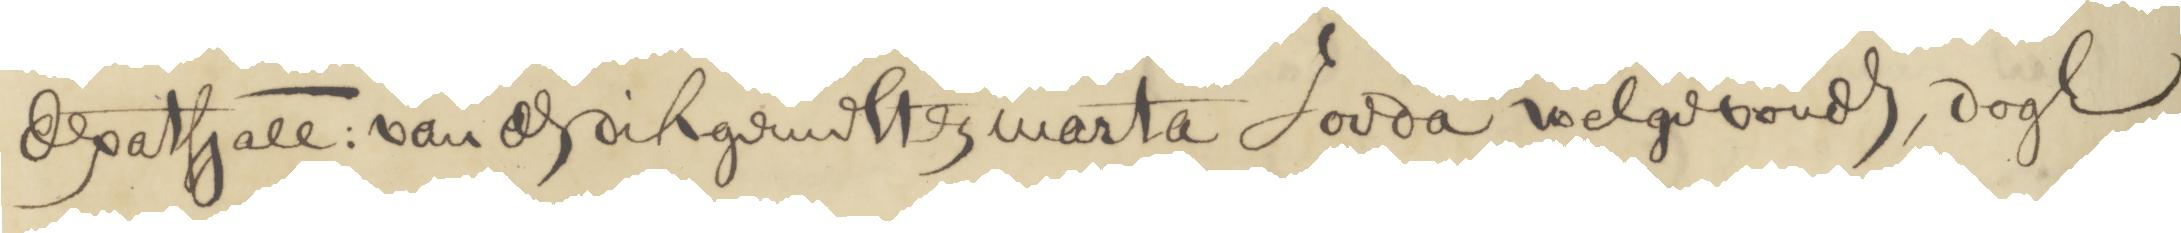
de patsjall: van den dik gemelten marta Joeda welgevonden, dogh
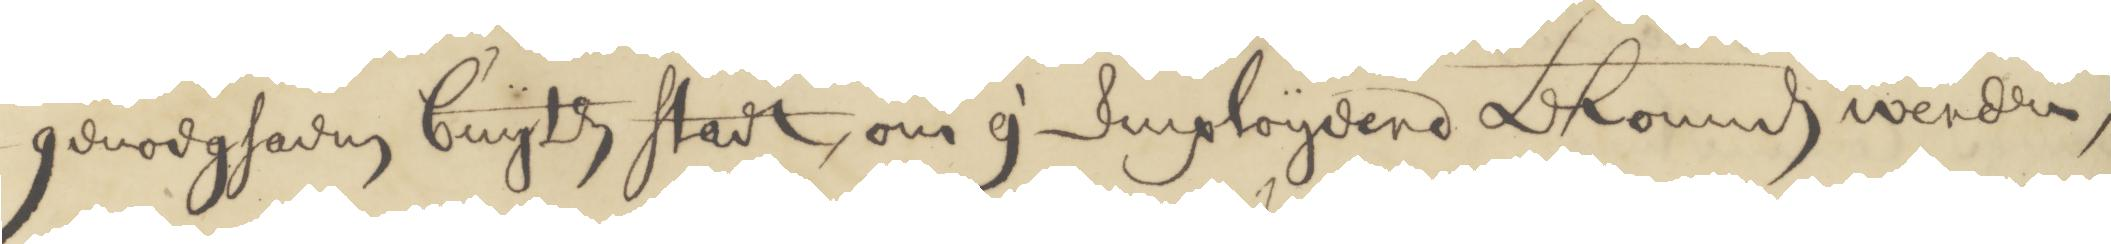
genoegsaem buijten staet, om g’ Emploijeerd te konnen werden,
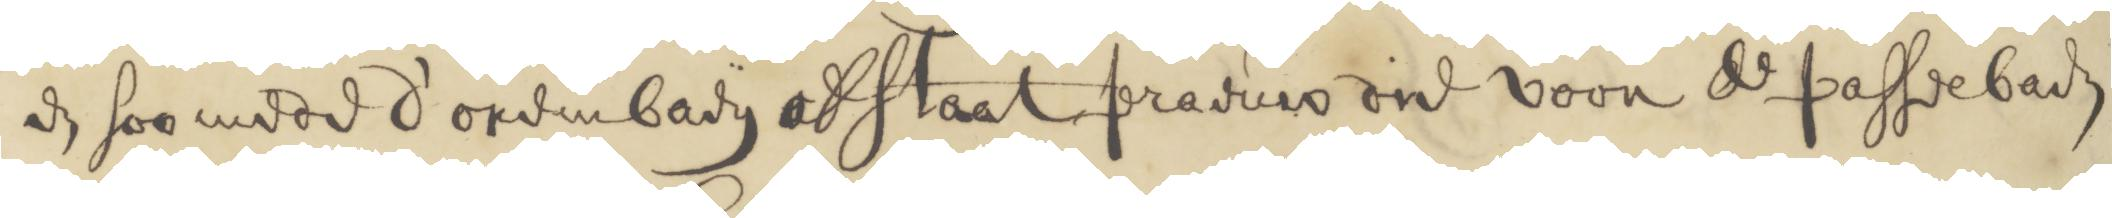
en soo mede d’ orembaeij afstaat praeuw die voor de passeebaen
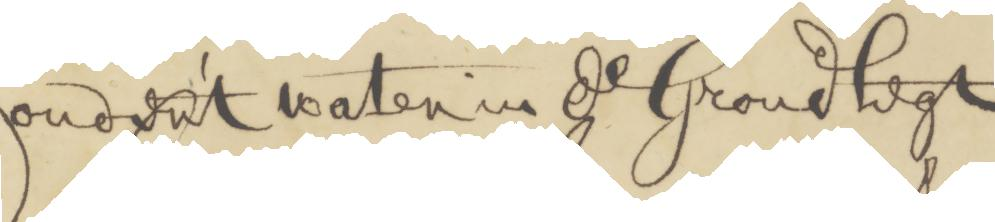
onder't water in de Grondlegt
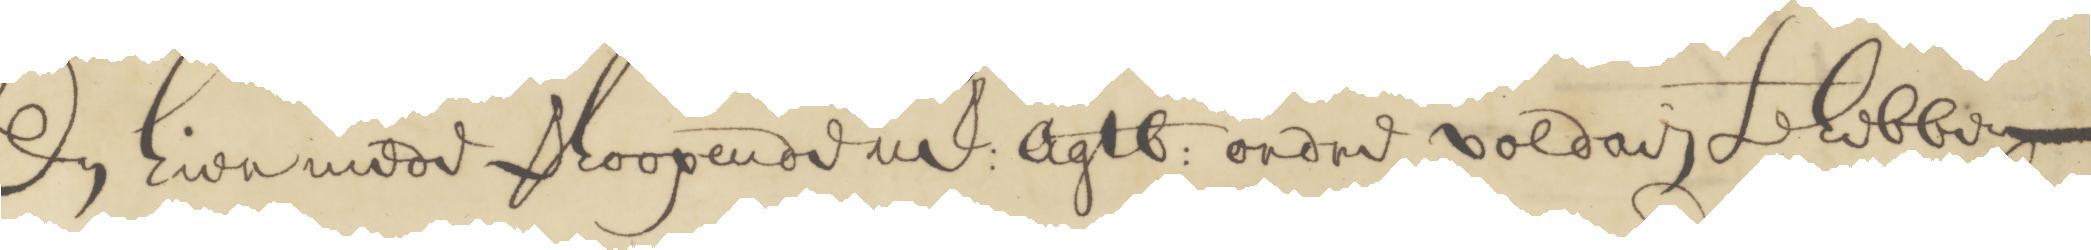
En hier mede verhoopende uE: Agtb: ordre voldaen te hebben
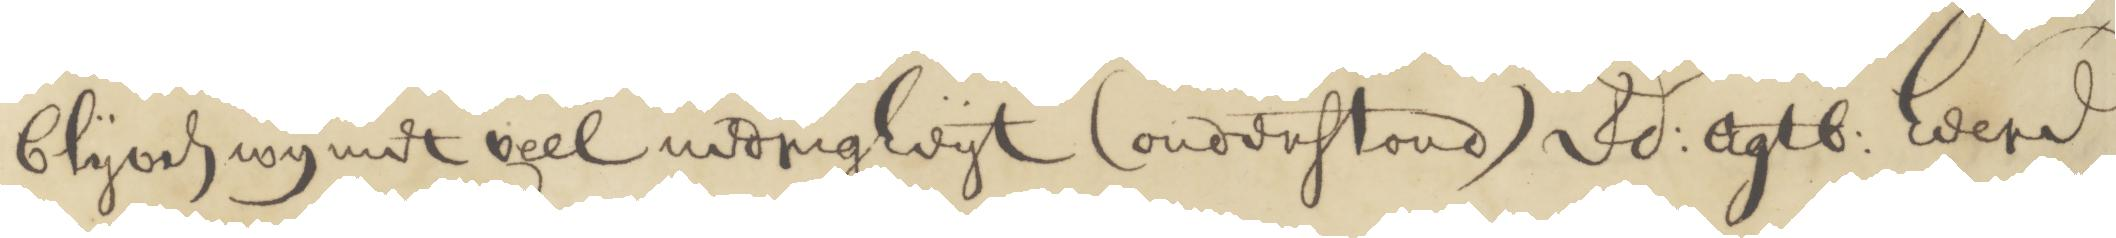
blijven wij met veel nedrigheijt (onder stond) Ed: agtb: heere
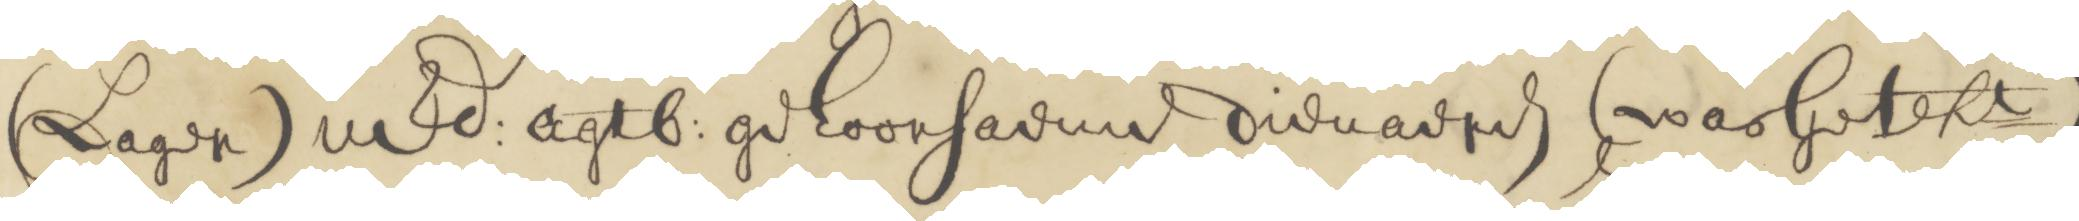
(Lager) uEd: agtb: gehoorsaeme dienaeren (was Getek=t
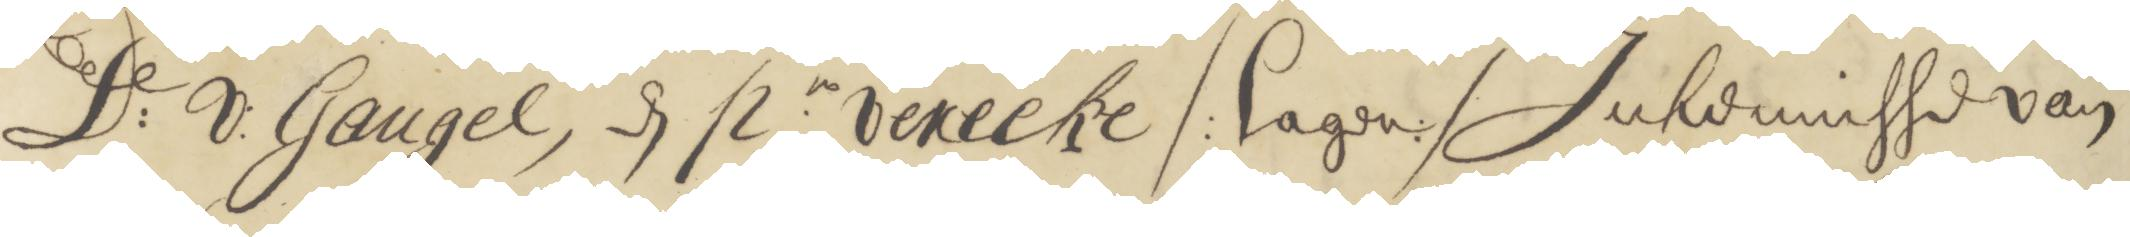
D:l v: Gangel, en p:r vereeke /:lager:/ Jn kennisse van
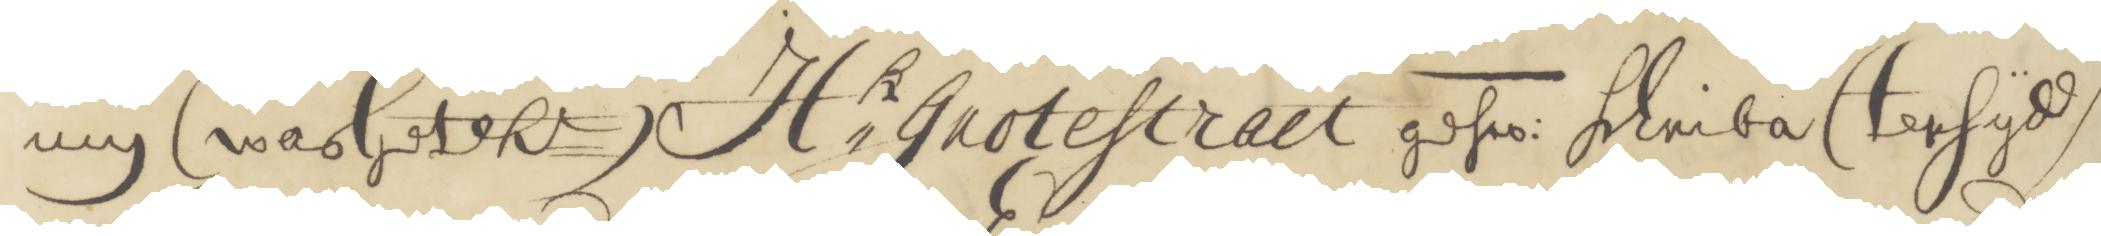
mij (was Getek=t) H„k Grotestraet gesw: schriba (tersijde)
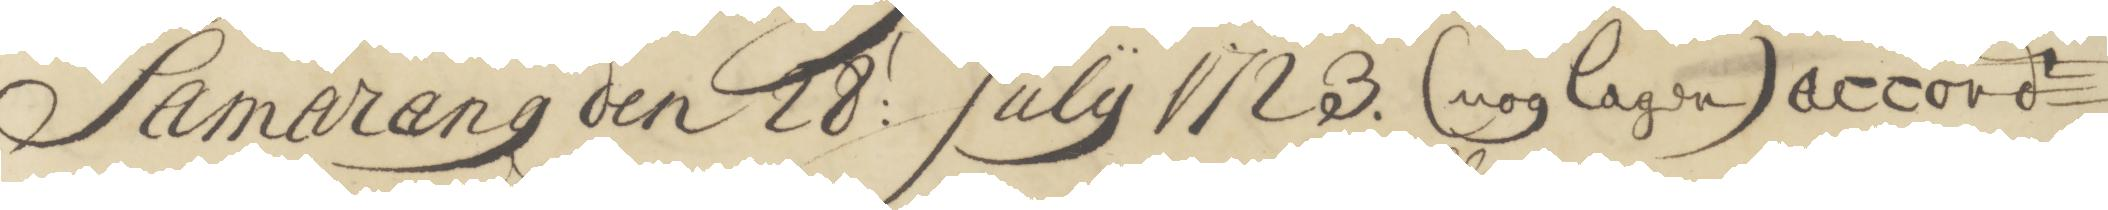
Samarang den 28:' Julij 1723. (nog lager) accord=t
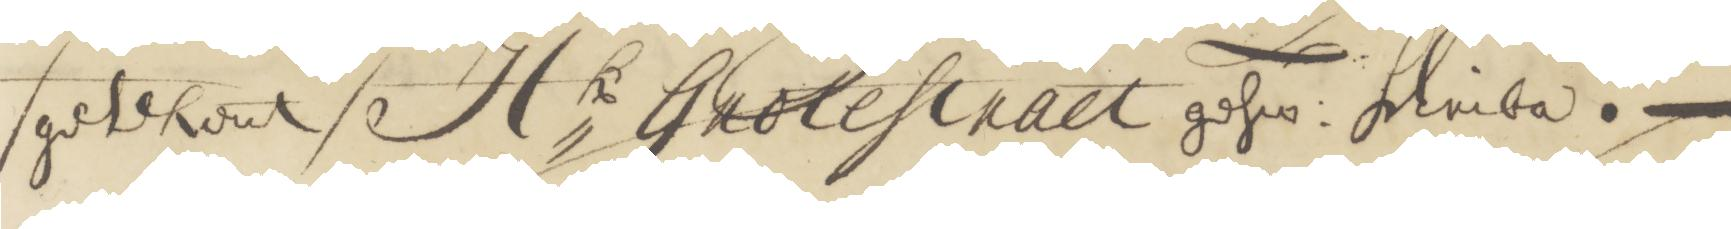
/getekent/ H„k Grotestraet gesw: schriba. —
